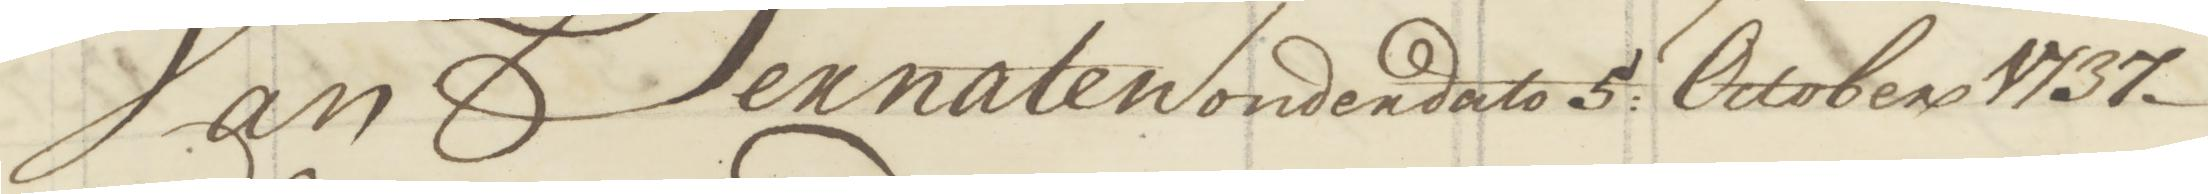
Van Ternaten onder dato 5: October 1737.
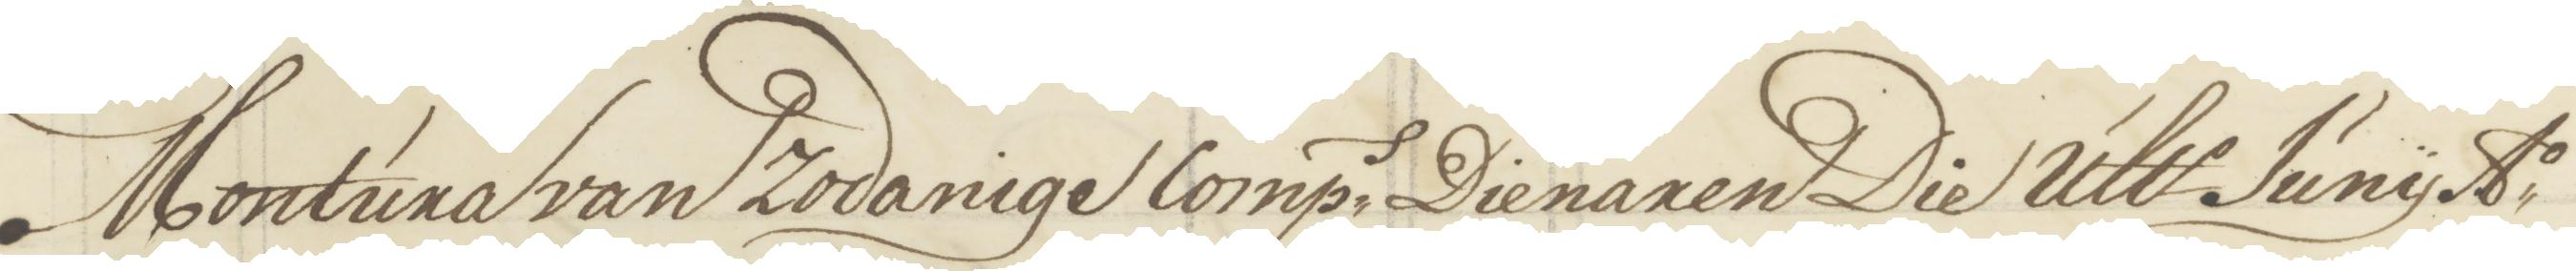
Montura van zodanige Comp„s Dienaren Die ult=o Iunij A„o
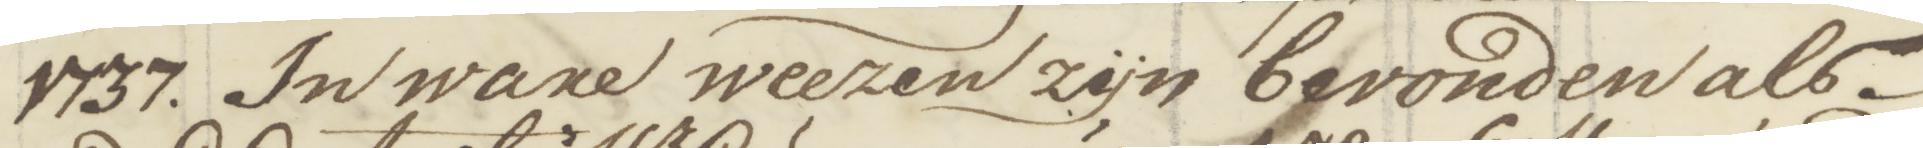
1737. In ware weezen zijn bevonden als.
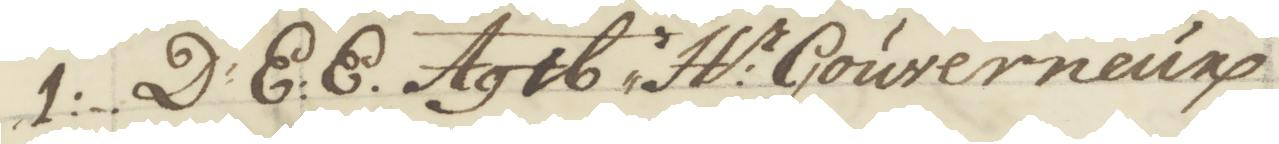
1:–. D: E: E. Agtb„e H:r Gouverneur
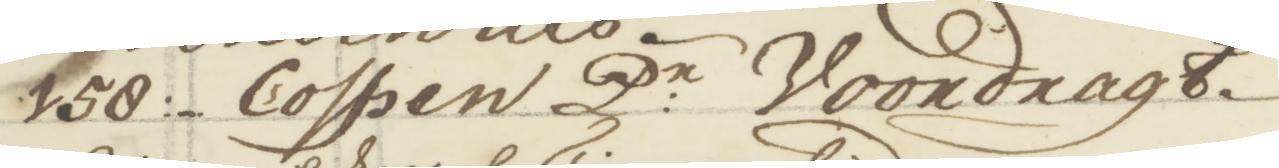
158:-. coppen P:r Voordragt.
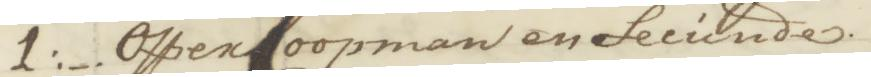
1:–. OpperCoopman en Secunde.
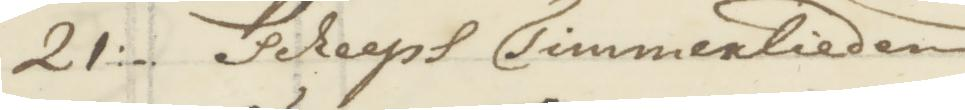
21:-. scheeps Timmerlieden
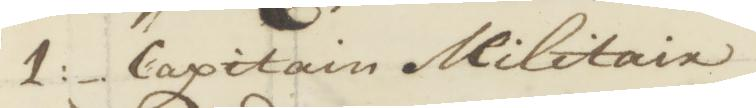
1:–. Capitain Militair
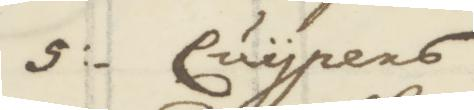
5:- Cuijpers
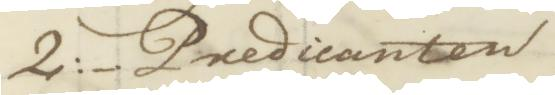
2:–. Predicanten
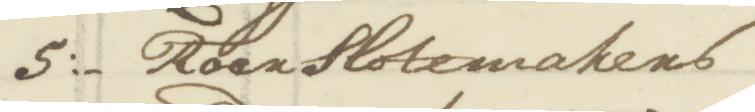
5:– Roerslotemakers
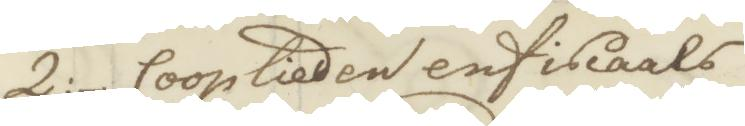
2:– Cooplieden enfiscaals
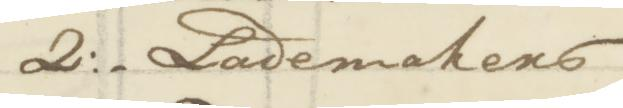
2:- Lademakers
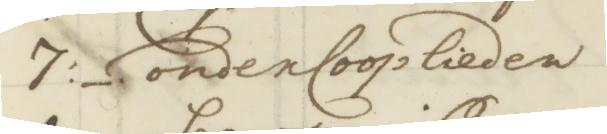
7:–. onderCooplieden
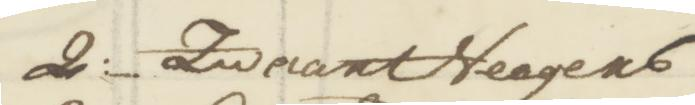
2:–. Zwaart Veegers
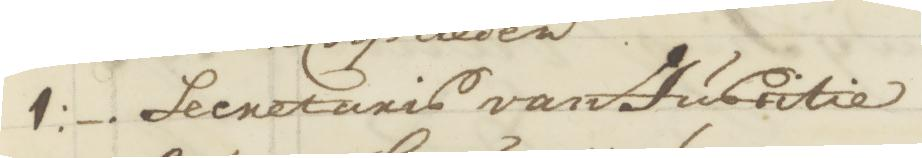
1:–. Secretaris van Justitie
